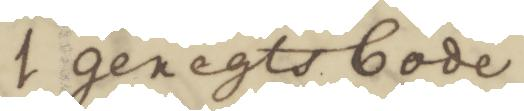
1 geregtsbode
